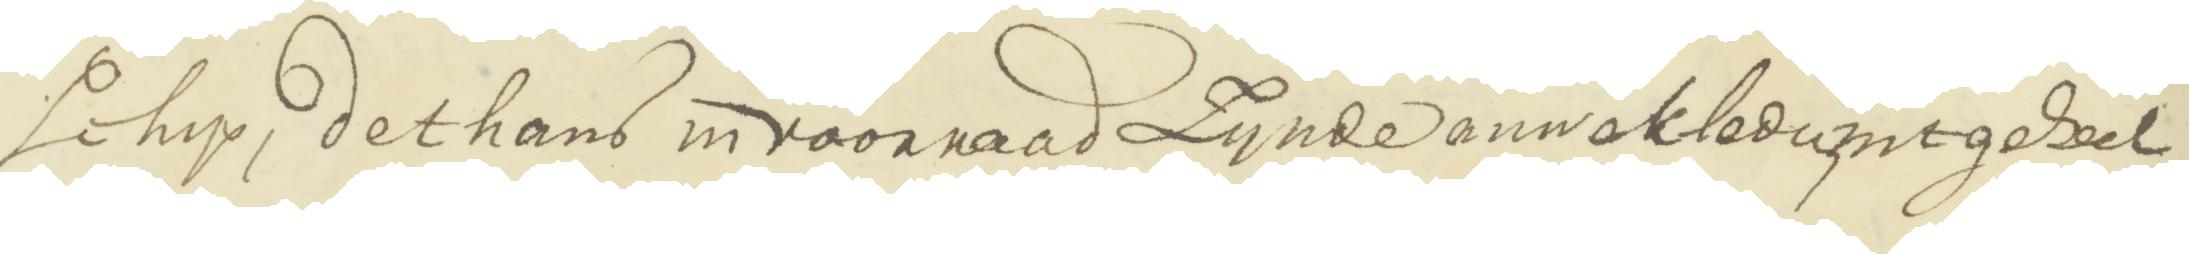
Schip, de thans in voorraad Zynde auwe kleden int geheel
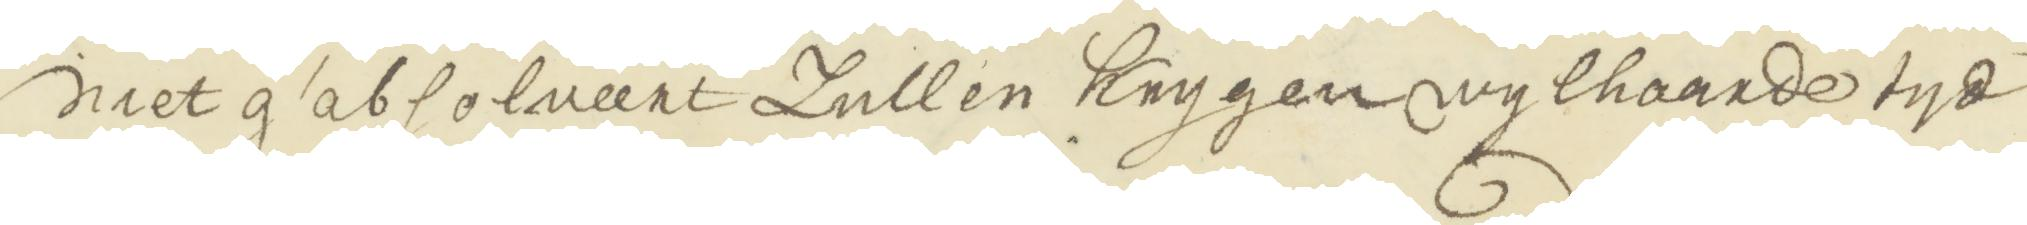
niet g’absolveert Zullen krygen wyl haarde tyd
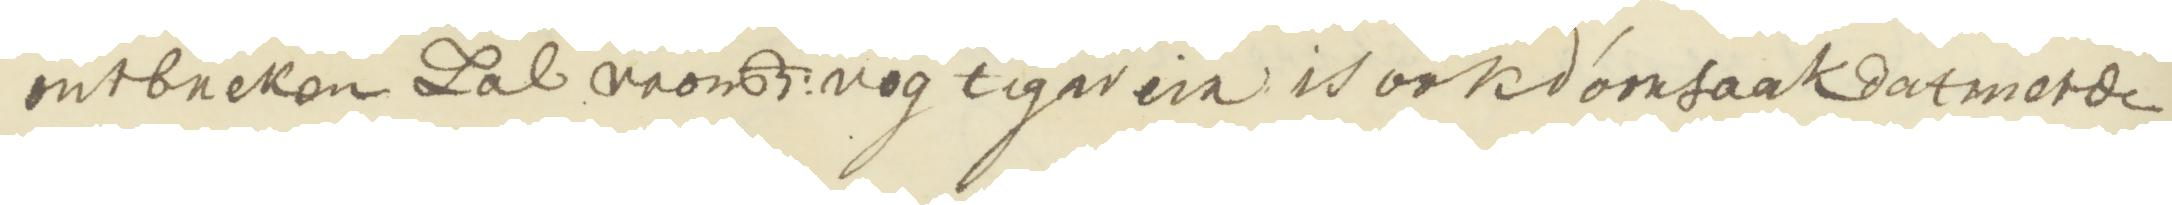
ontbreken Zal voorsz: vog tig weir is ook d'oorsaak dat met de
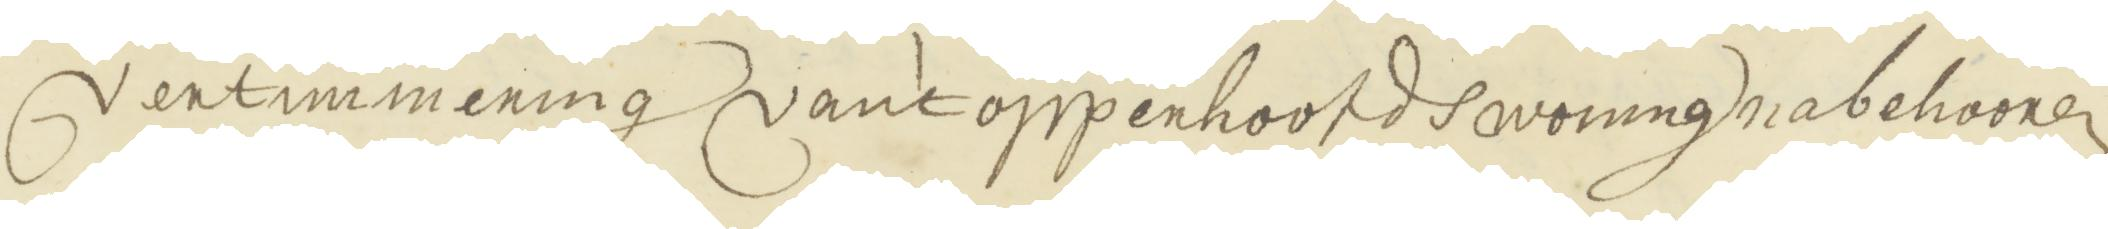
vertimmering van't opperhoofds woning na behooren
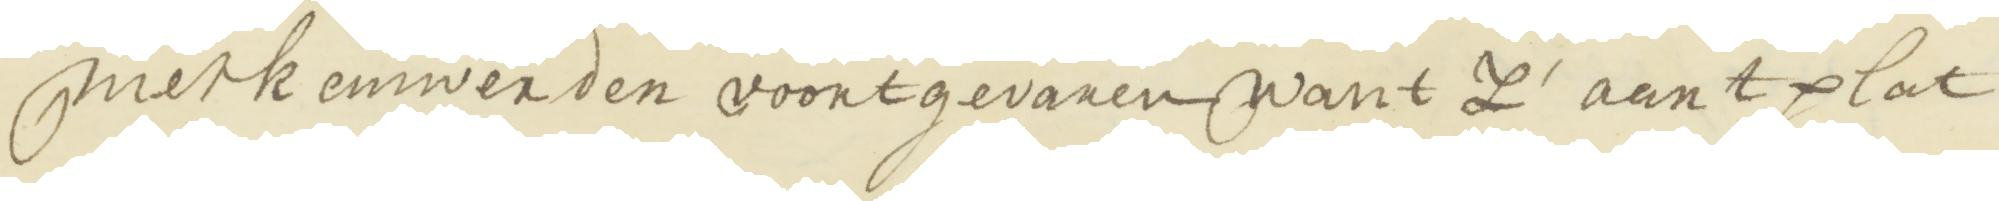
niet kanwerden voortgevaren want Z' aant plat
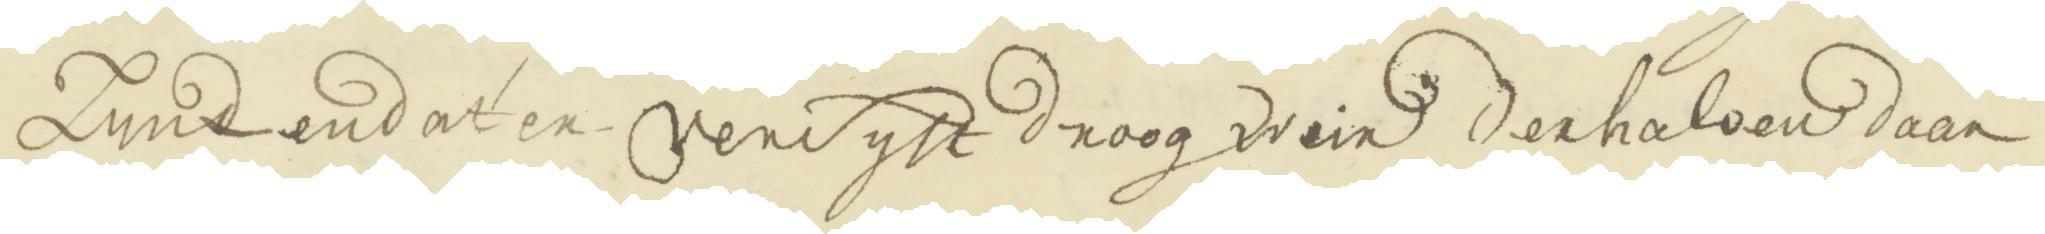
Zynd en dat'er vereyst droog weir derhalven daar
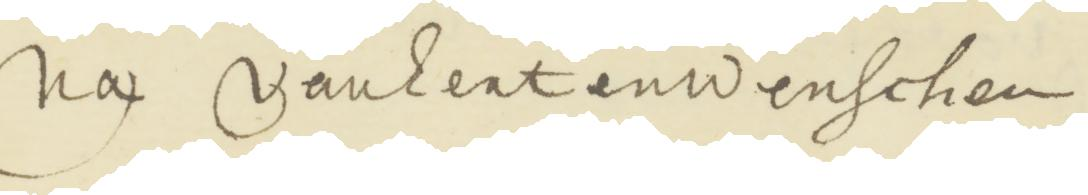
na van herten wenschen
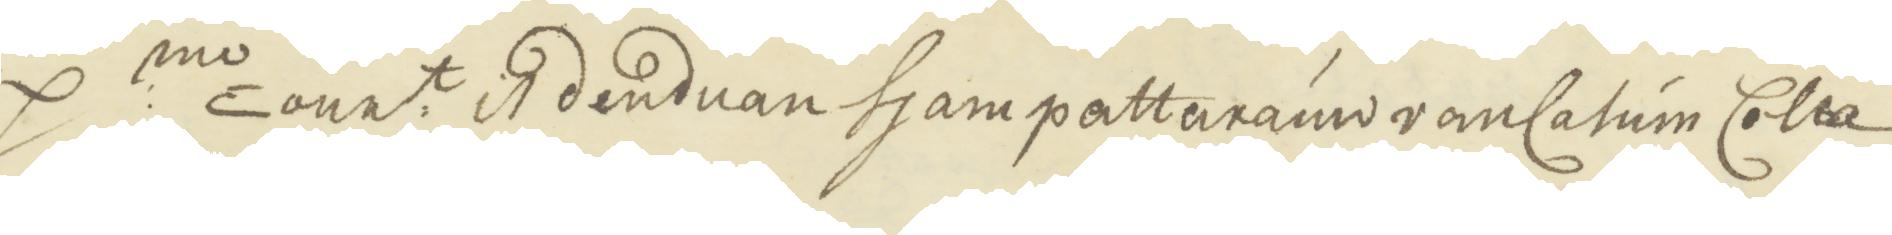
p:mo cour:t is den duan Sjam pattarauw van Catum Colta
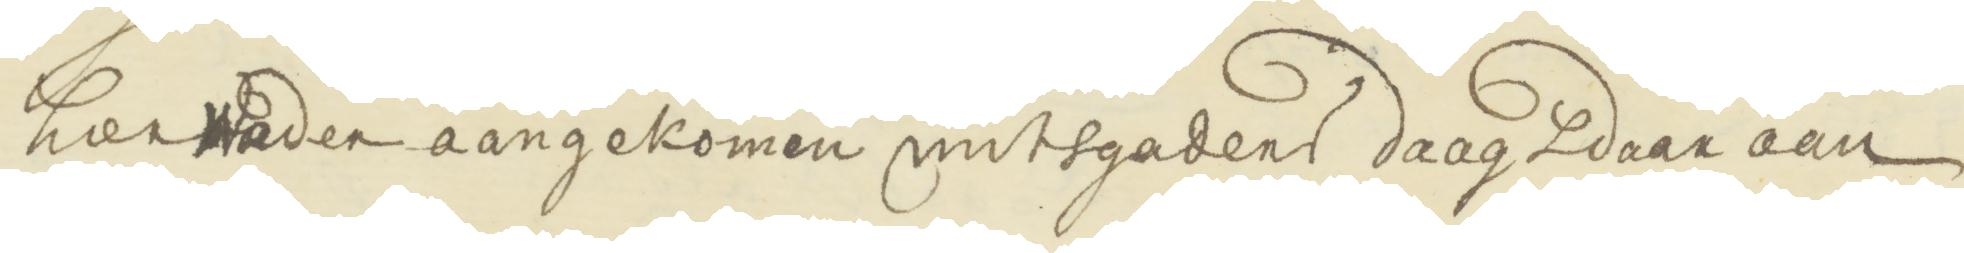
hier weder aangekomen mitsgaders daags daar aan
